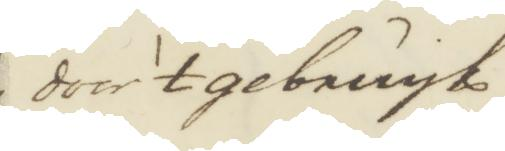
door ’t gebruyk
